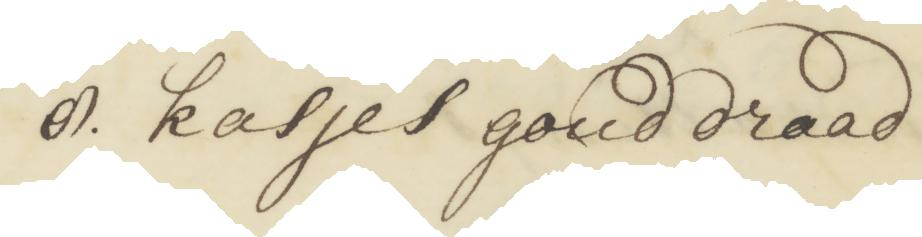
8. kasjes gouddraad
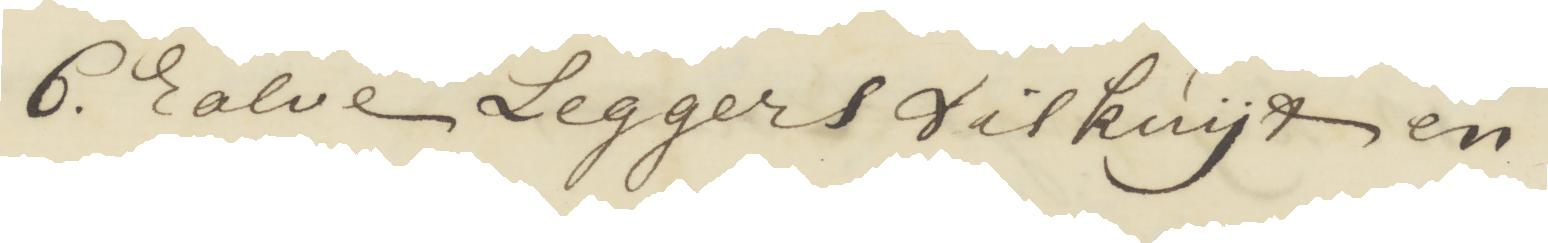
6. halve Leggers viskuijt en
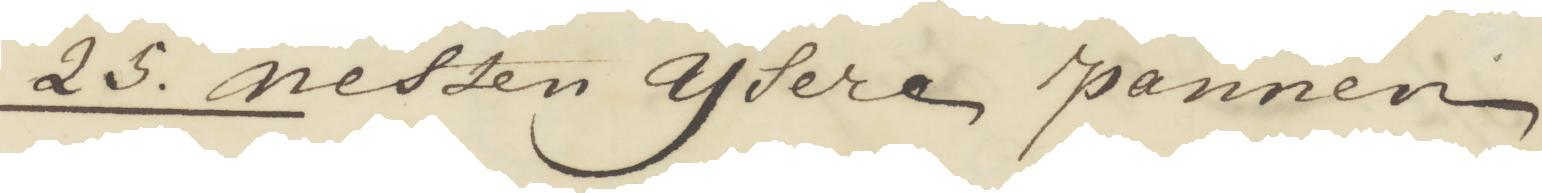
25. nesten ijsere pannen
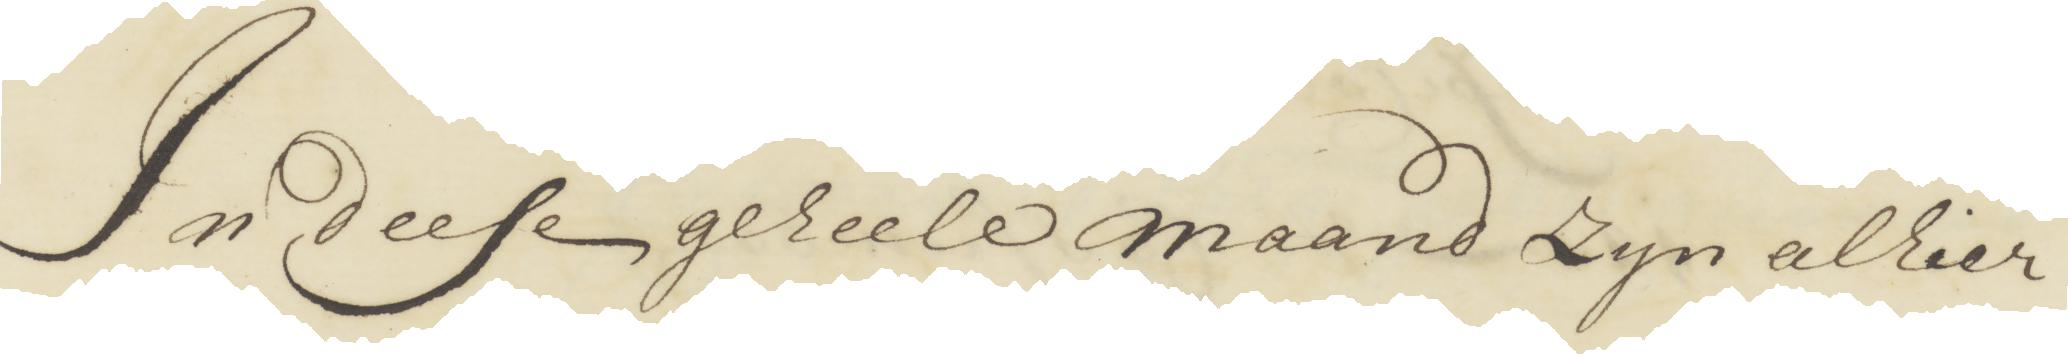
Jn deese geheele maand zyn alhier
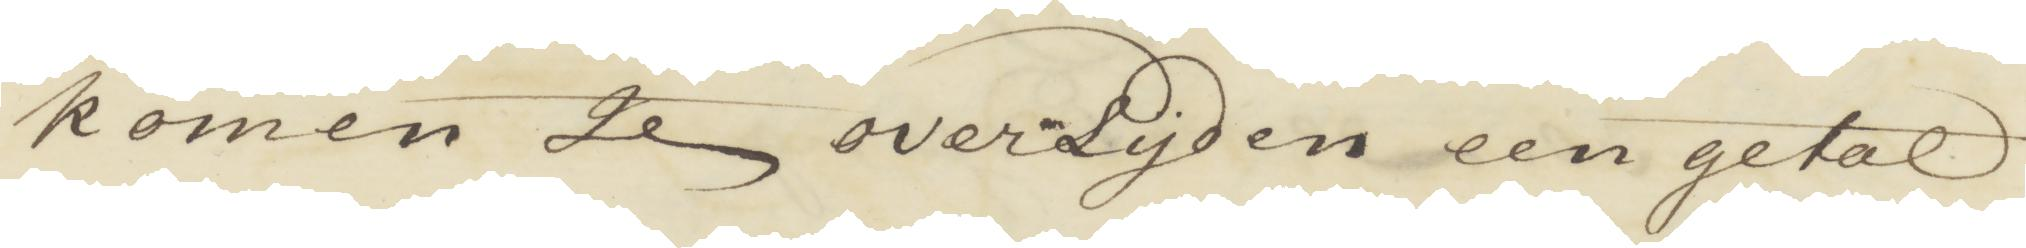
komen te overlijden een getal
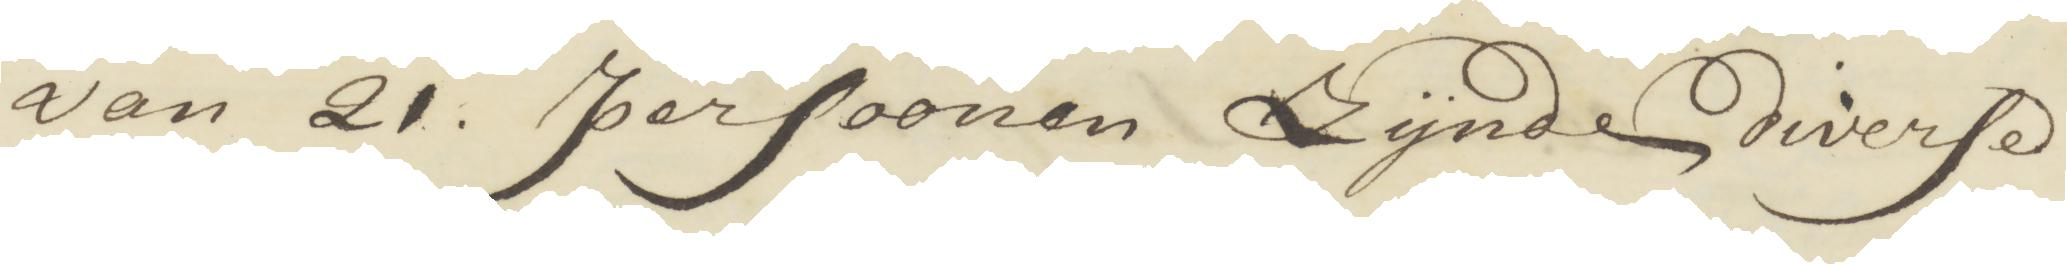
van 21. persoonen zijnde diverse
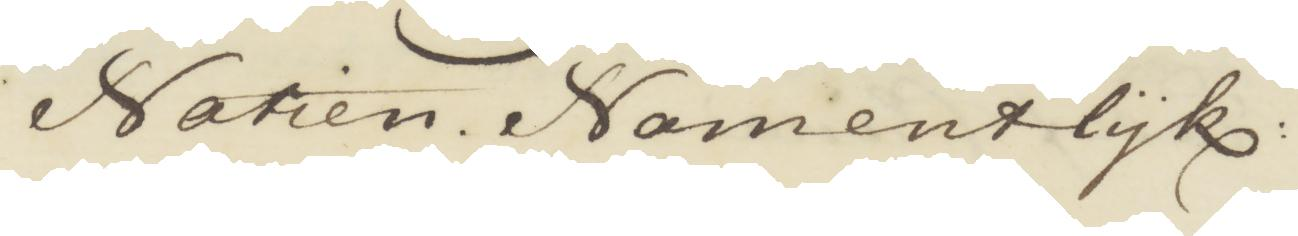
Natien. Namentlijk:
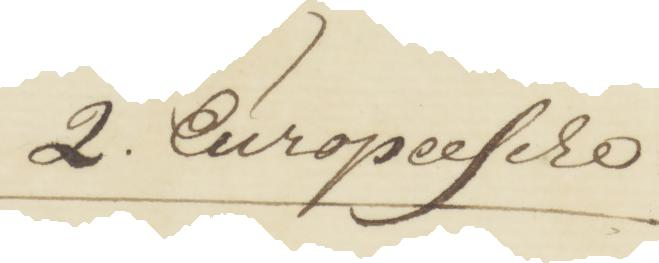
2. Europeesche
